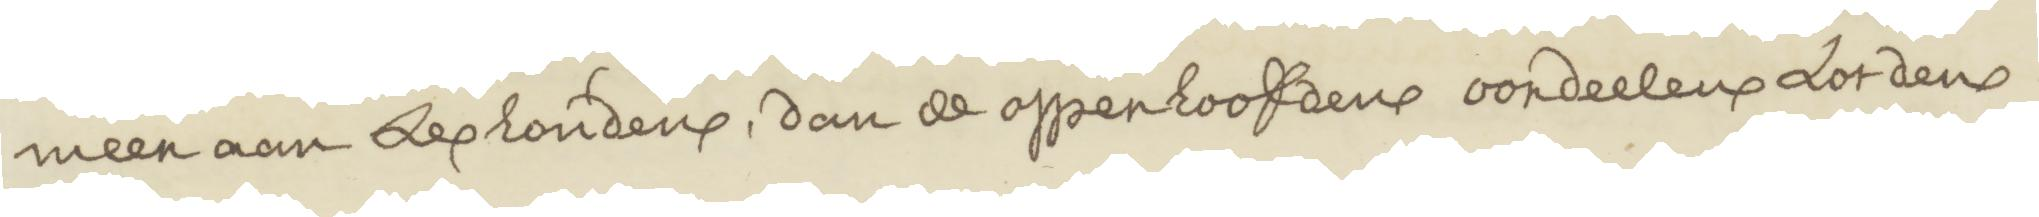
meer aan te houden, dan de opperhoofden oordeelen tot den
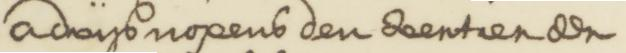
advijs nopens den vertier der
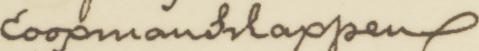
coopmanschappen
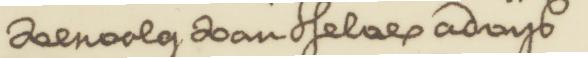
vervolg van 'tselve advijs
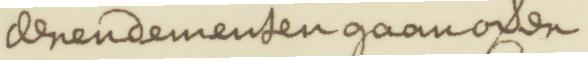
derendementen gaan overer
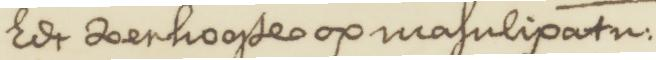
het verkogte op masulipatn:
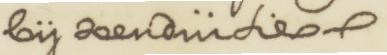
bij verduitie —
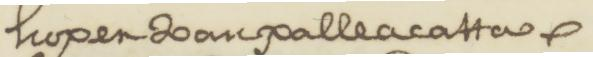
koper van palleacatta —
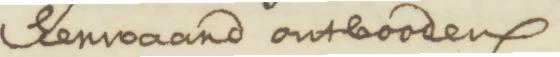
herwaard ontbooden
